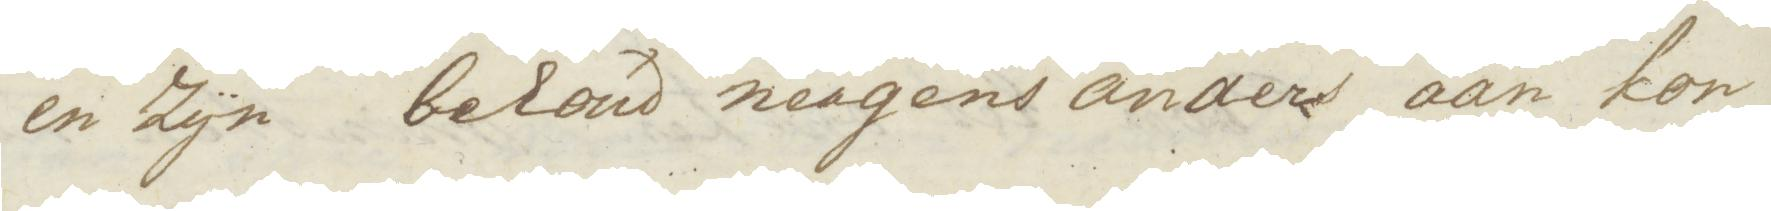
en Zijn behoud nergens anders aan kon
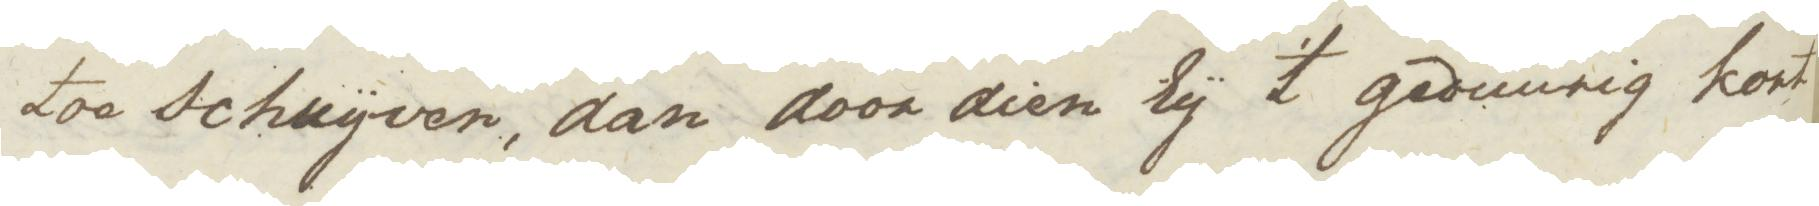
toe schuijven, dan door dien hij ’t geduurig kort
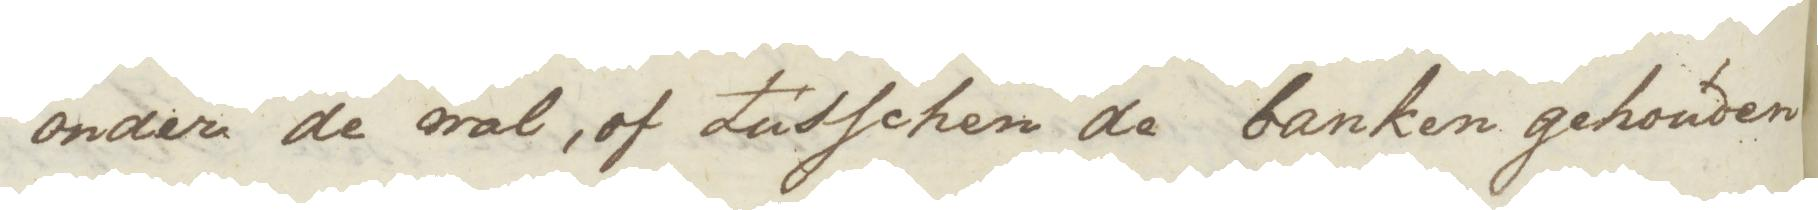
onder de wal, of tusschen de banken gehouden
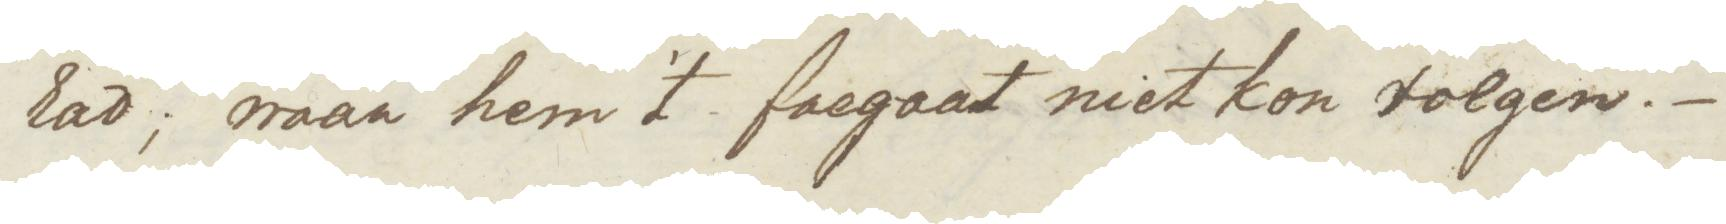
had; waar hem ’t fregaat niet kon volgen.—
